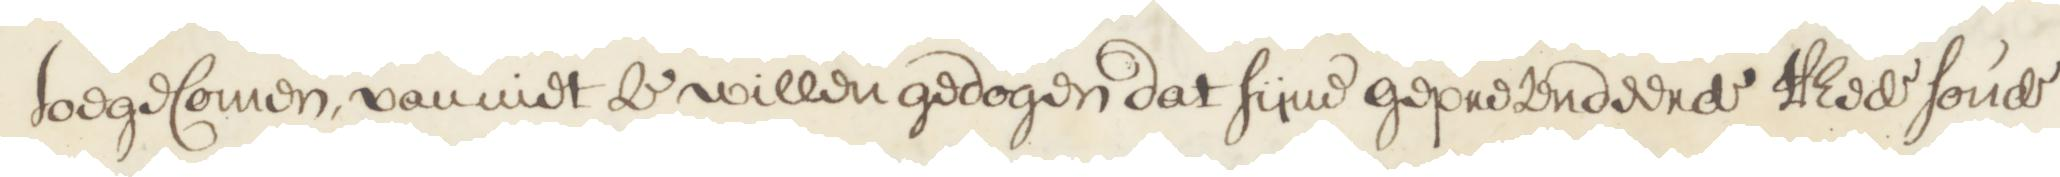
toegecomen, van niet te willen gedogen dat sijne gepretendeerde Rhede soude
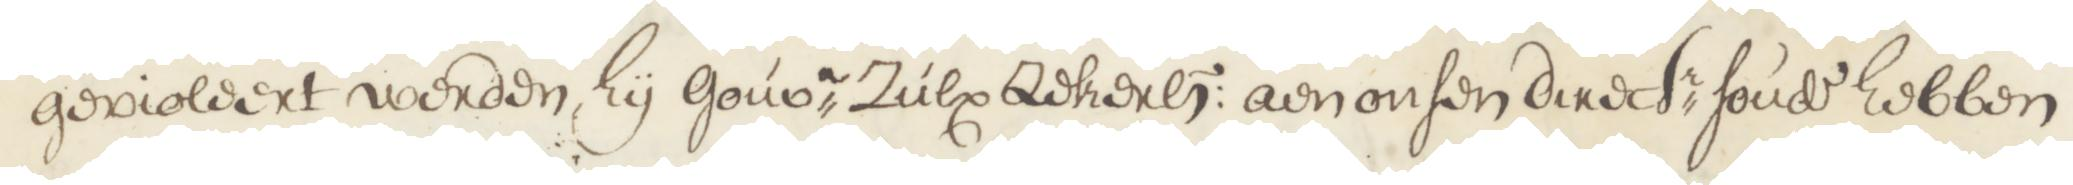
gevioleert werden, hij gouv„r zulx zekerlijk aen onsen direct„r soude hebben
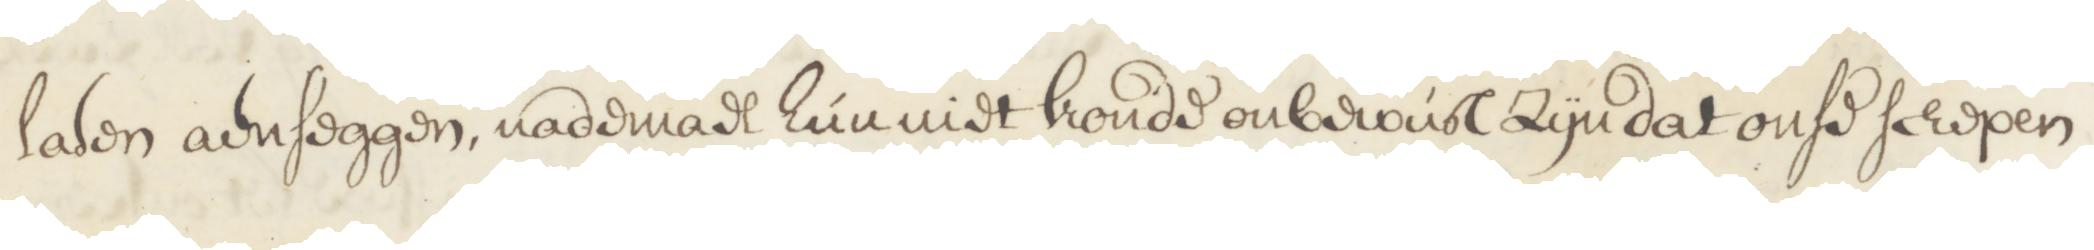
laten aenseggen, nademael hun niet konde onbewust zijn dat onse schepen
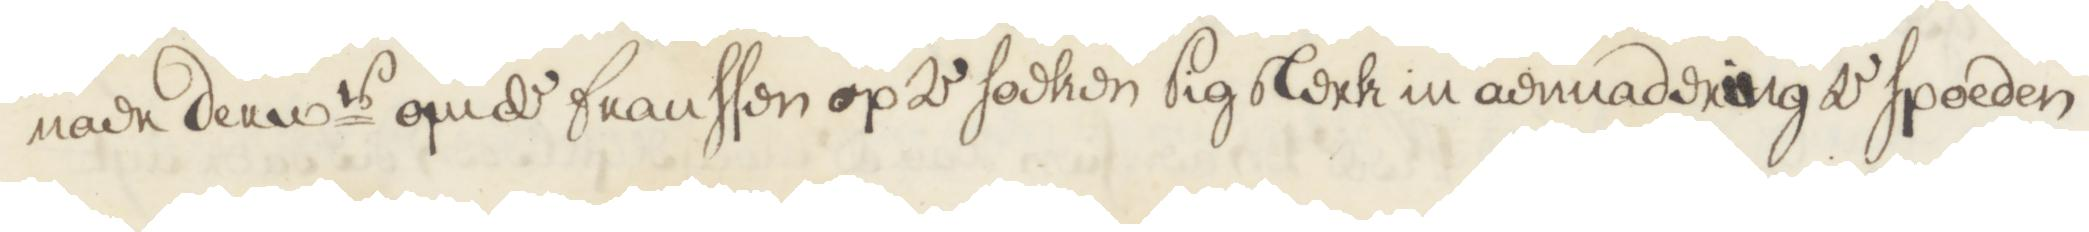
naer derw=ts om de franssen op te soeken sig sterk in aennadering te spoeden
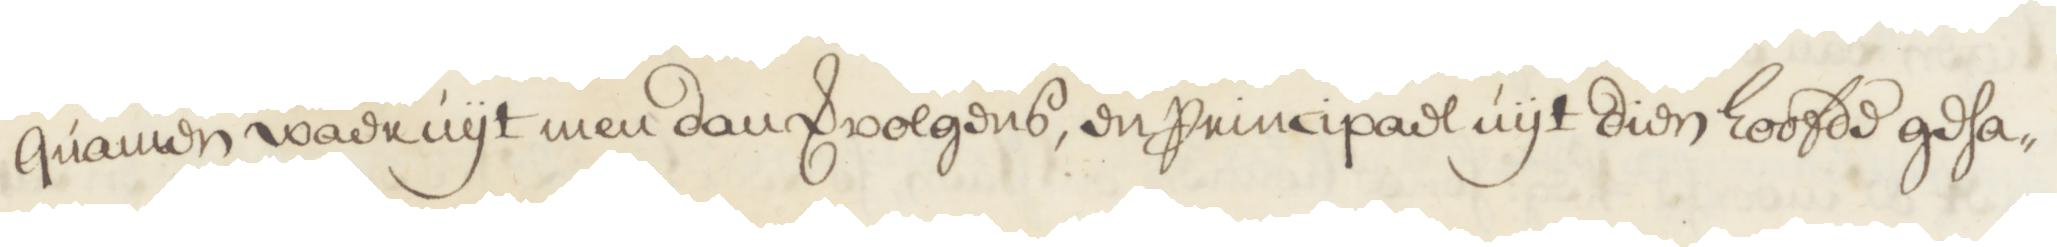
quamen waeruijt men dan vervolgens, en principael uijt dien hoofde gesa„
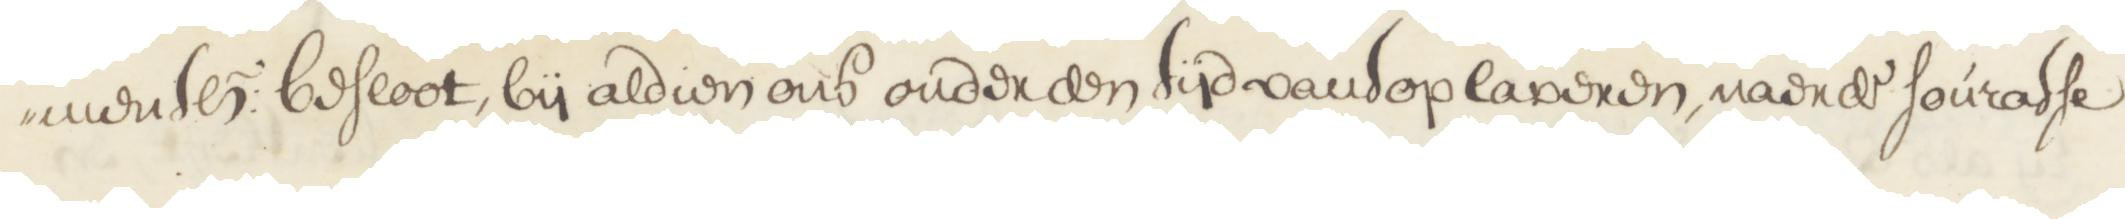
„mentlijk besloot, bij aldien ons onder den tijd van't op laveren, naer de souratse
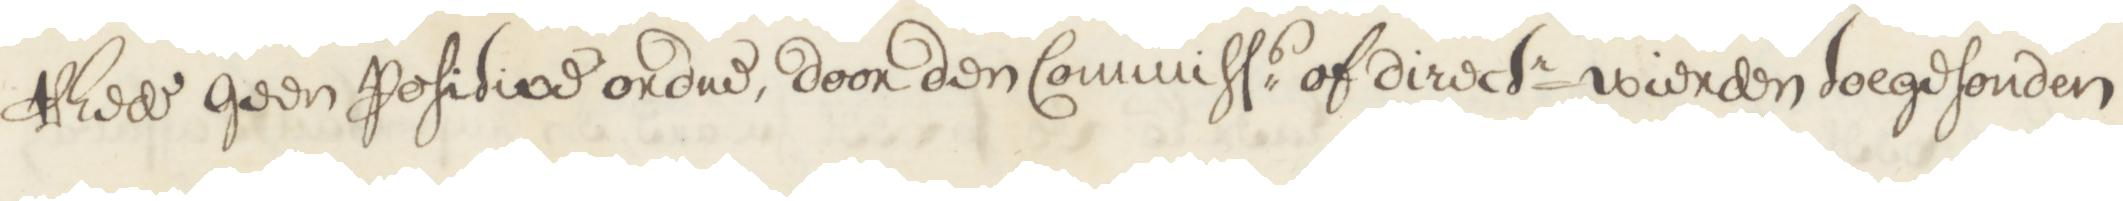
Rhede geen positive ordre, door den Commiss„s of direct=r wierden toegesonden
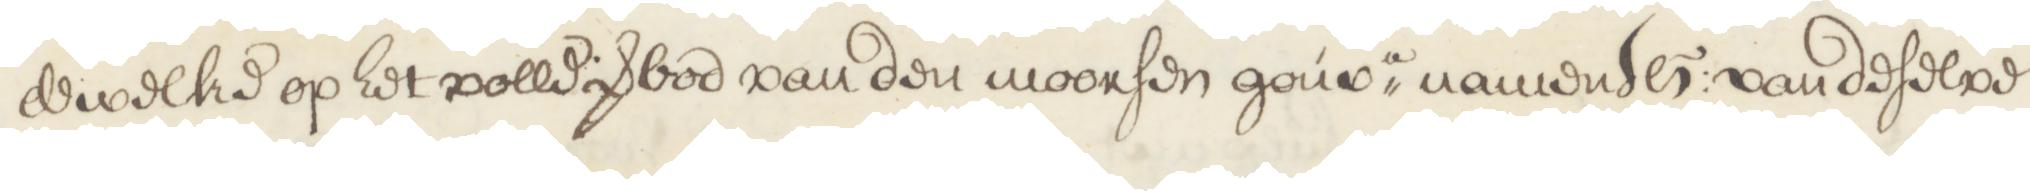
dewelke op het volle verbod van den moorsen gouv„r namentlijk van deselve
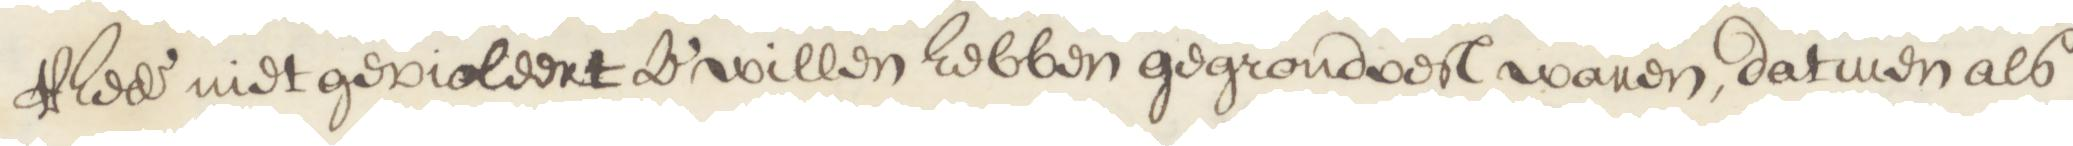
Rhede niet gevioleert te willen hebben gegrondvest waren, dat men als
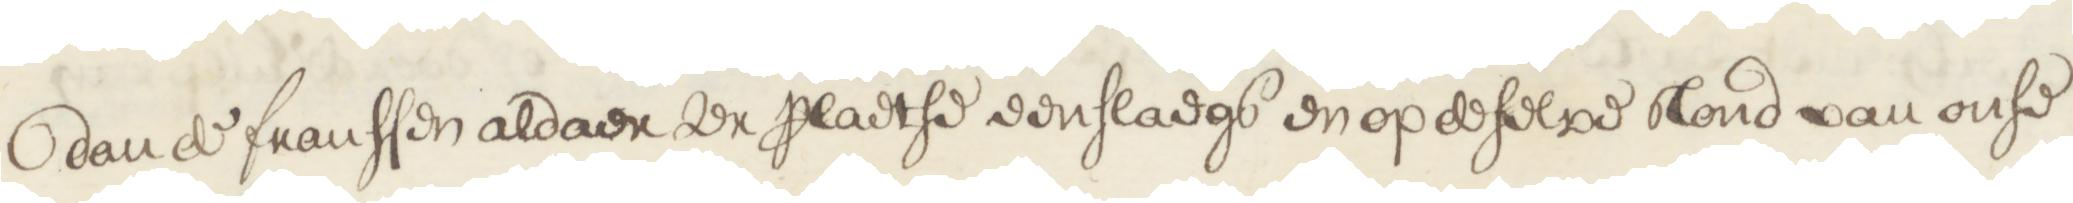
dan de franssen aldaer ter plaetse een slaegs en op deselve stond van onse
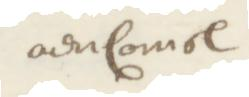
aencomst
